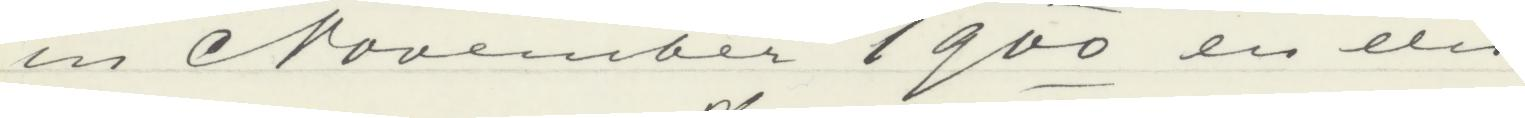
in November 1900 en een
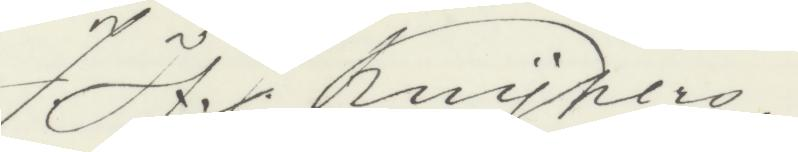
J. H. J. Kuijpers,
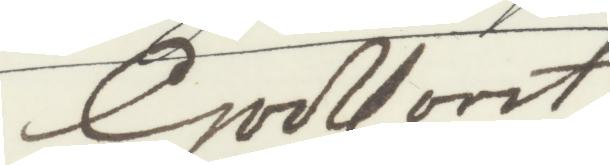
GvdHorst
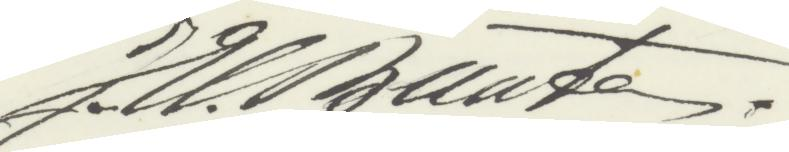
J.H. Baaten.
